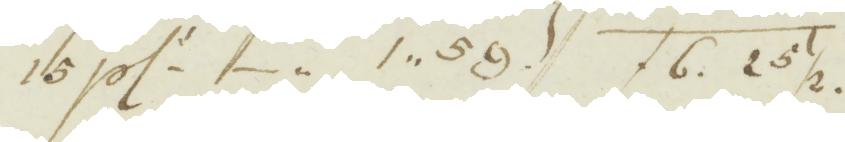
16p pC-t – „ 1„ 59. ƒ6.25½.
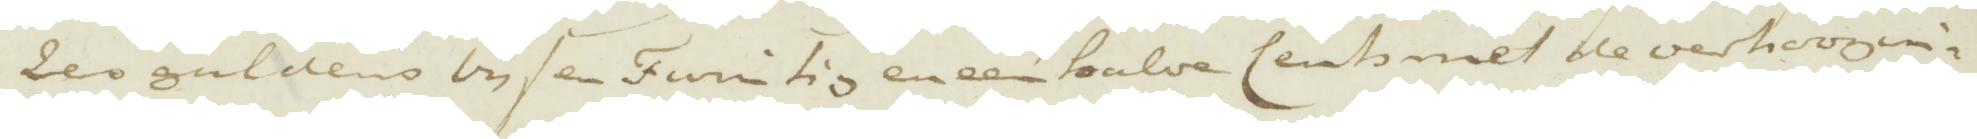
Zes guldens vijf en twintig en een halve Cents met de verhoogin„
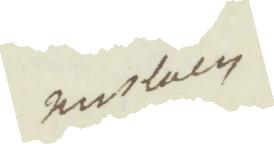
nustulen
